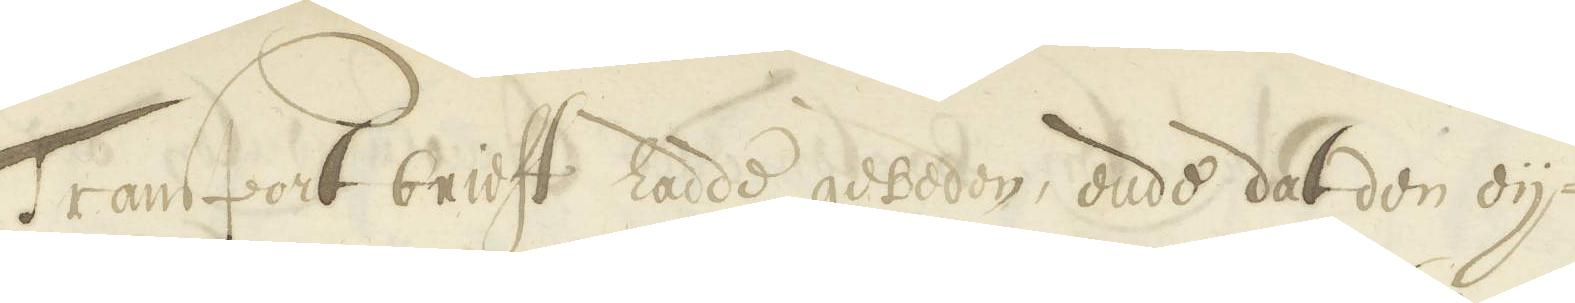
Transport brieff hadde gebeden, ende dat den eij=r
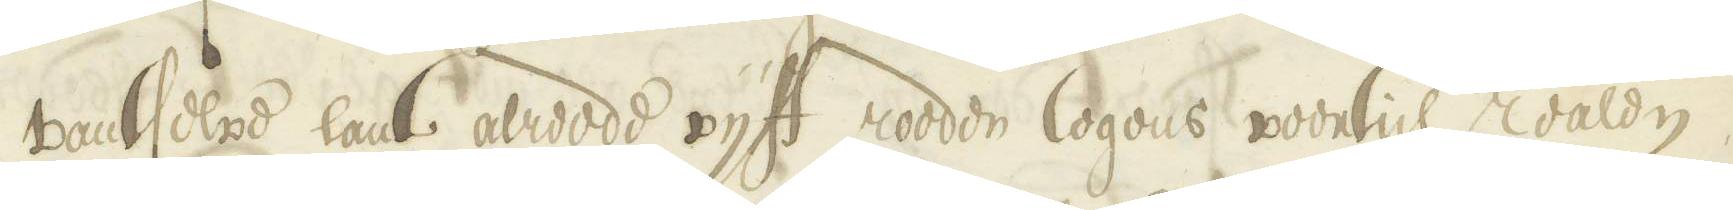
vantselve lant alreede vijff roeden tegens voortien realen
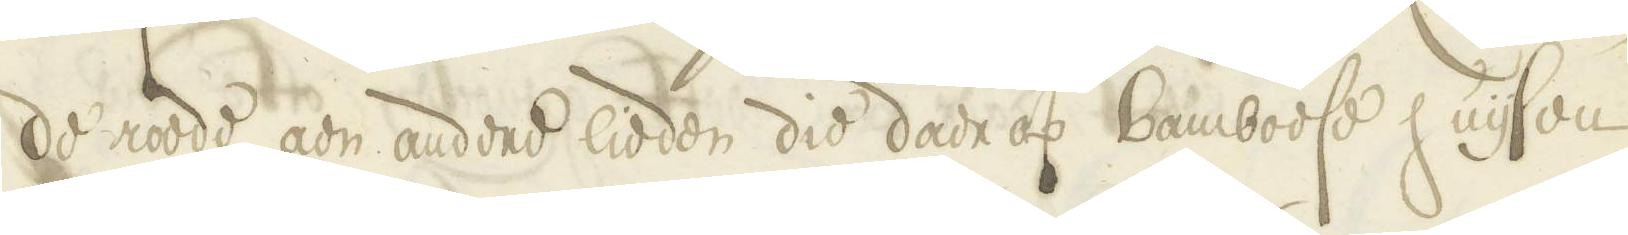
de roede aen andere lieden die daer op bamboese huijsen
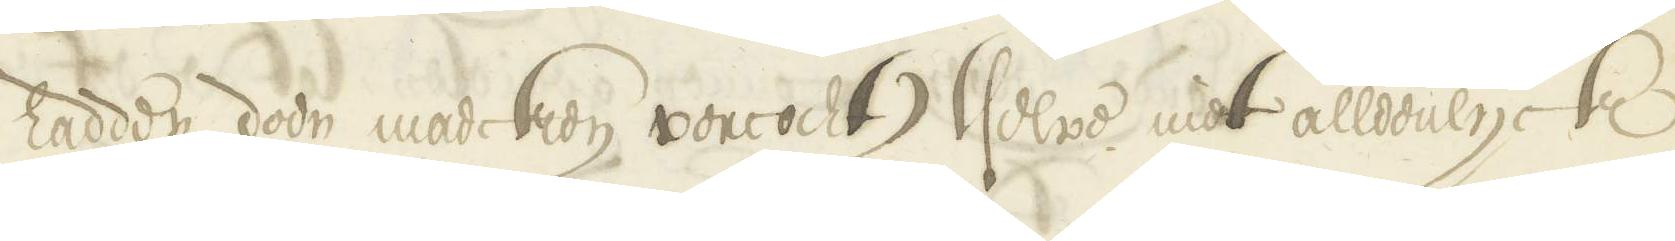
hadden doen maecken vercocht) tselve niet alleenlijck
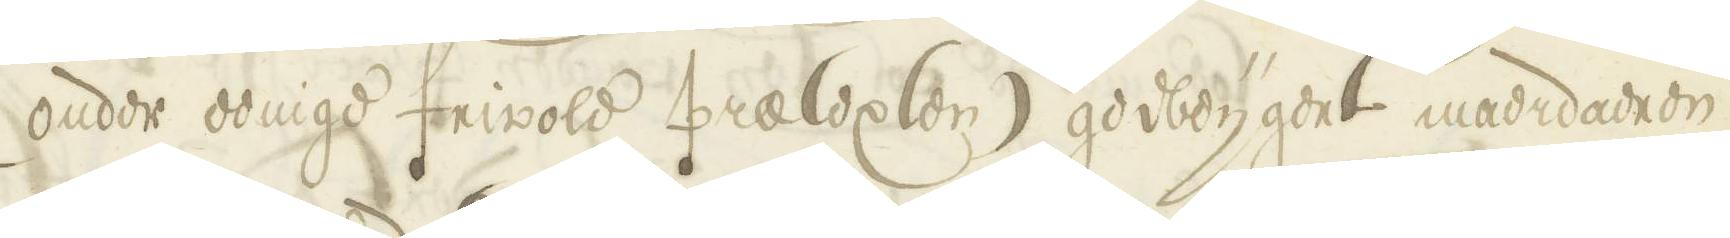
(: onder eenige frivole praetexten ) geweijgert maer daer en
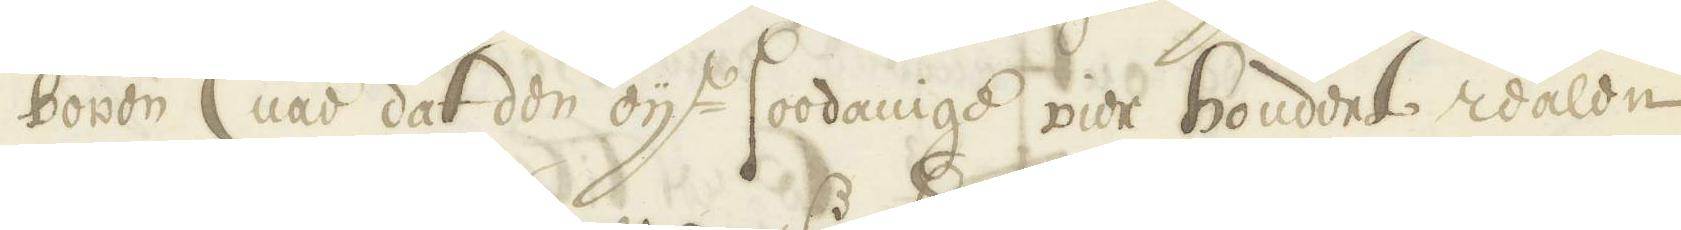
boven ( nae dat den eij=r soodanige vier hondert realen
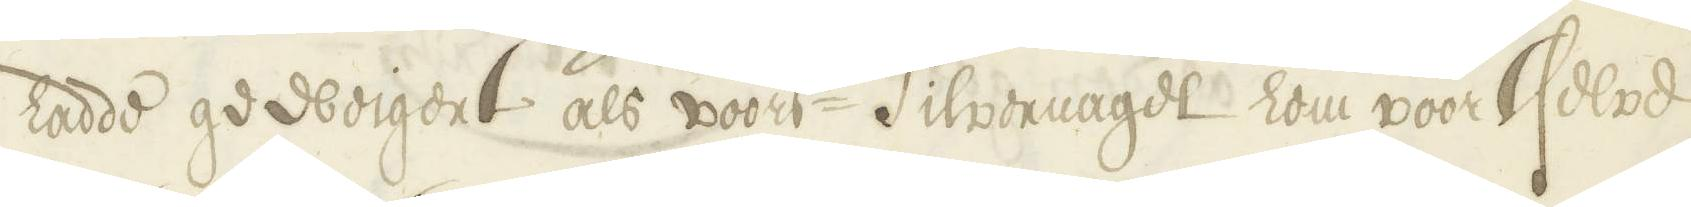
hadde geweigert als voors=z Silvernagel hem voor tselve
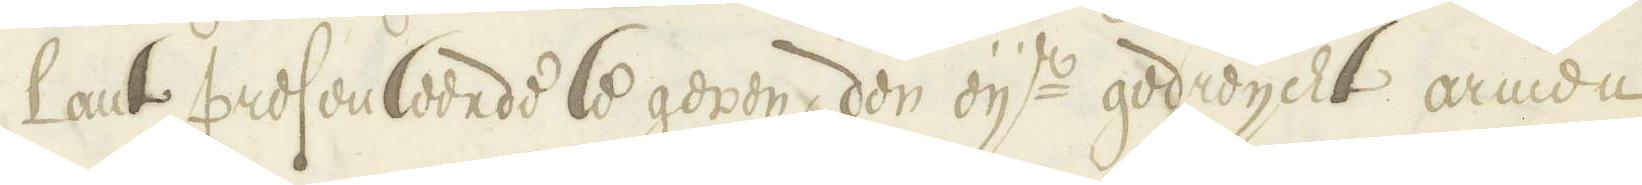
lant presenteerde te geven, den eij=r gedreijcht armen
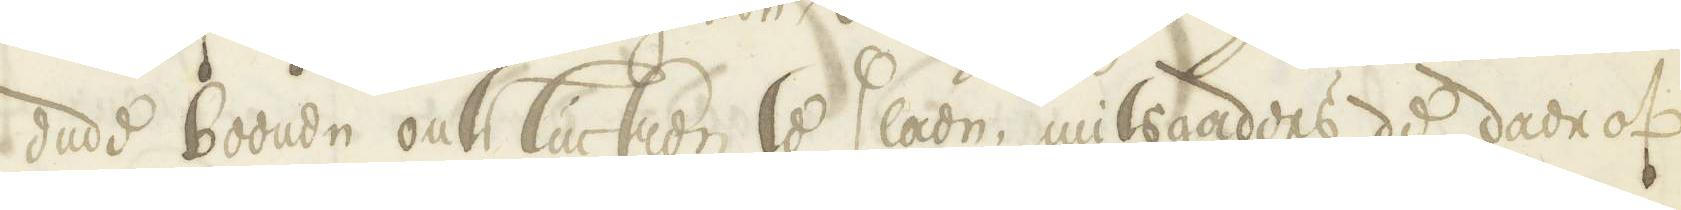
ende beenen ontstucken te slaen, mitsgaders de daerop
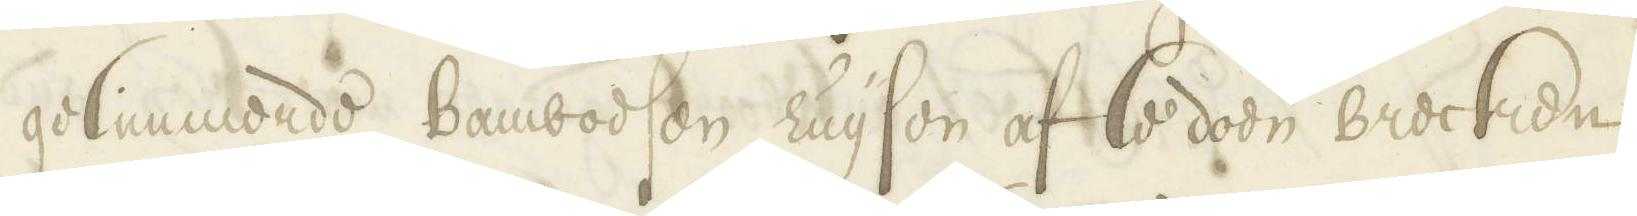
getimmerde bamboesen huijsen af te doen brecken
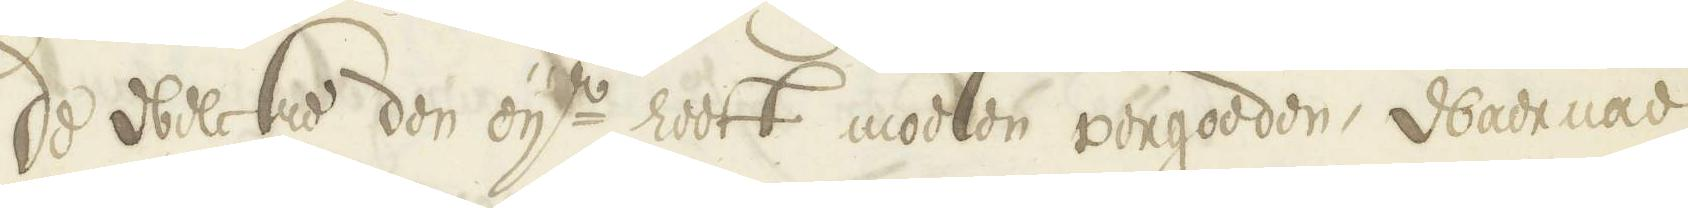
de welcke den eij=r heeft moeten vergoeden, waernae
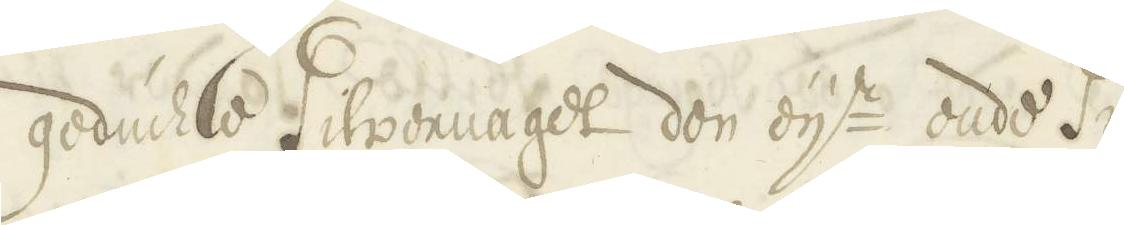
geduchte Silvernagel den eij=r ende Sijn huijsvrouw bij hem
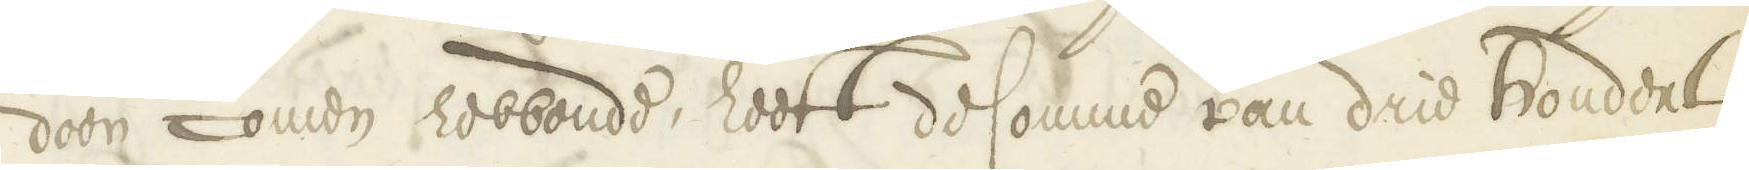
doen comen hebbende, heeft de somme van drie hondert
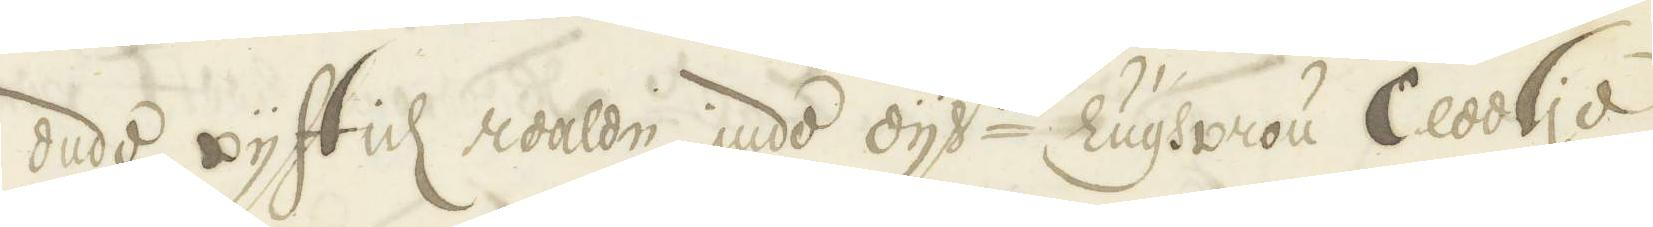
ende vijftich realen inde eijs=rs huijsvrou Cleesje
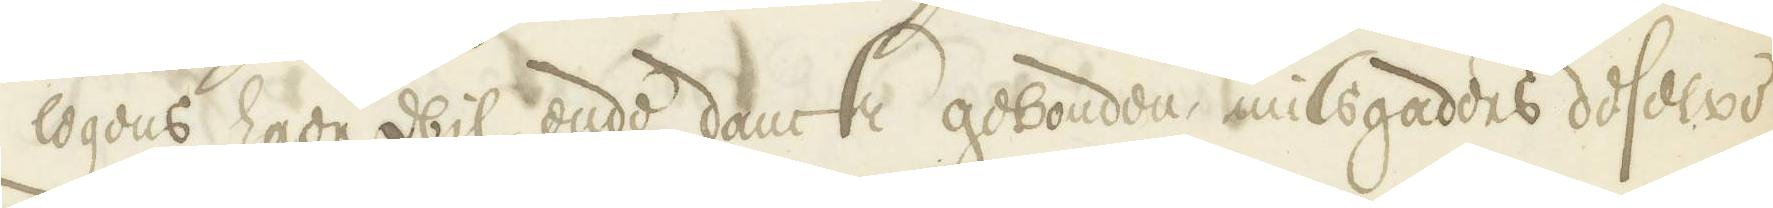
legens haer wil onde danck gebonden, mitsgaders deselve
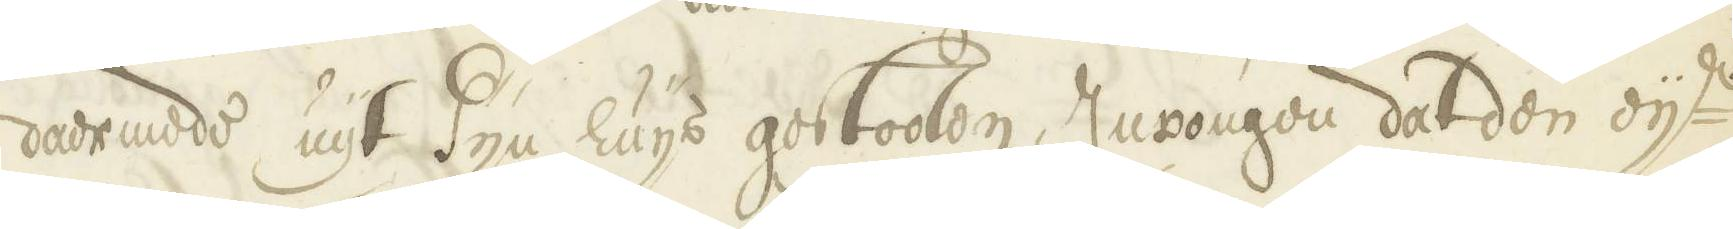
daermede uijt Sijn huijd gestooten, Jnvougen dat den eij=r
